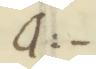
4: –
